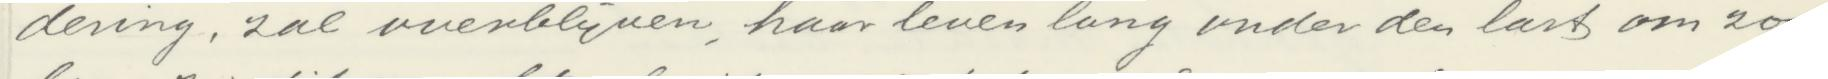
dering, zal overblijven, haar leven lang onder den last om zoo
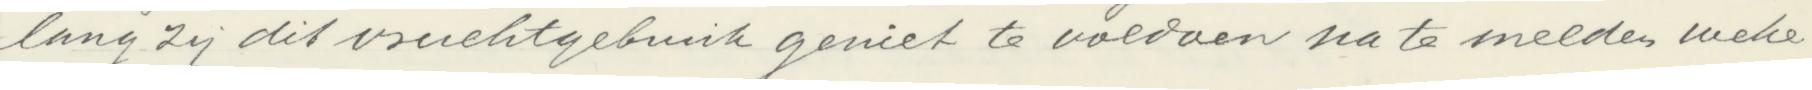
lang zij dit vruchtgebruik geniet te voldoen na te melden weke
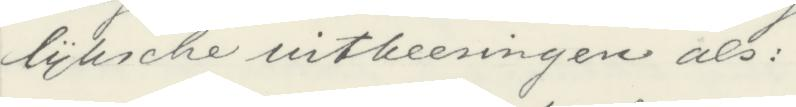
lijksche uitkeeringen als:
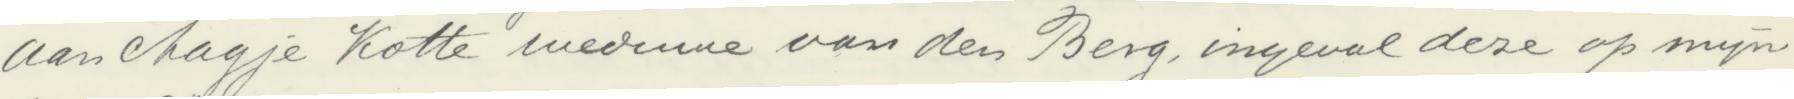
Aan Magje Kotte weduwe van den Berg, ingeval deze op mijn
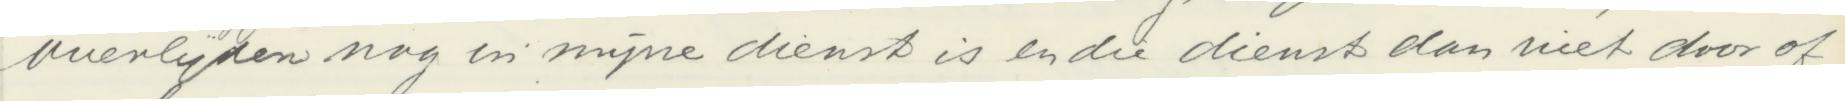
overlijden nog in mijne dienst is en die dienst dan niet door of
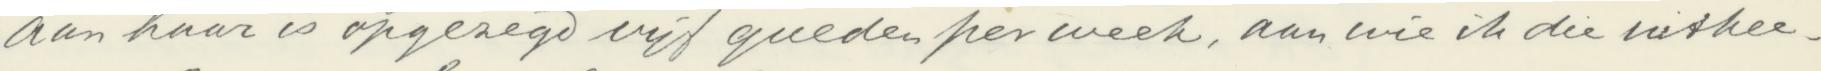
aan haar is opgezegd vijf gulden per week, aan wie ik die uitkee
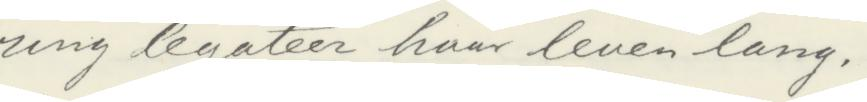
ring legateer haar leven lang,
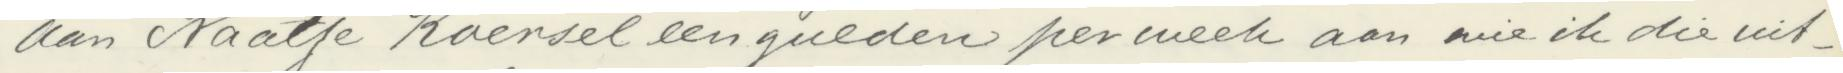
aan Naatje Koersel een gulden per week aan wie ik die uit-
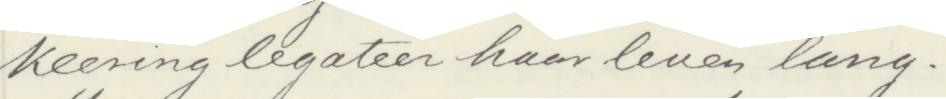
keering legateer haar leven lang.
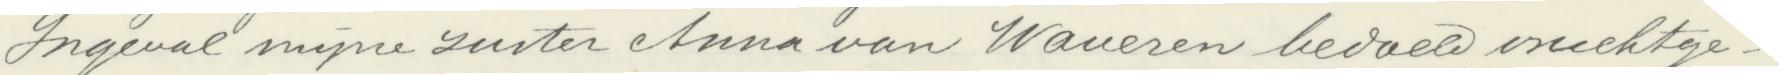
Ingeval mijne zuster Anna van Waveren bedoeld vruchtge
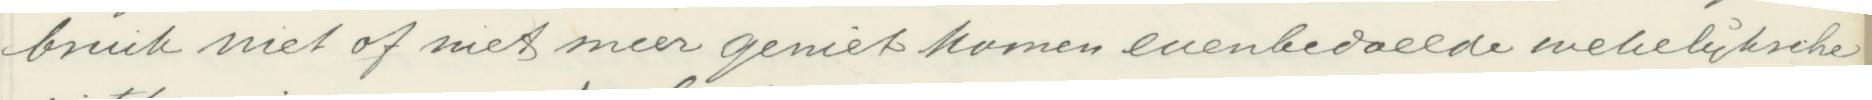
bruik niet of niet meer geniet komen evenbedoelde wekelijksche
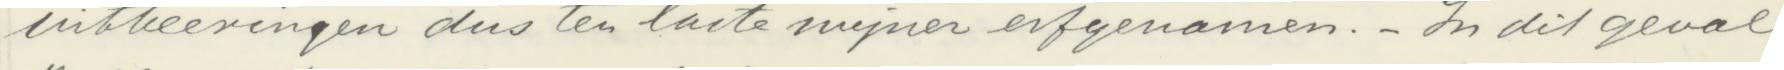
uitkeeringen dus ten laste mijner erfgenamen. - In dit geval
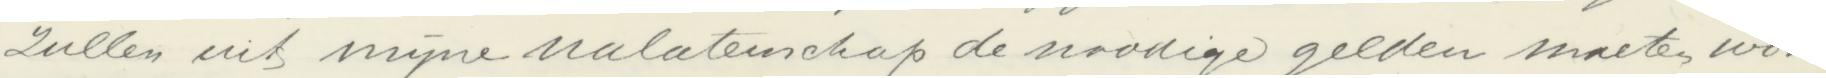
zullen uit mijne nalatenschap de noodige gelden moeten wor
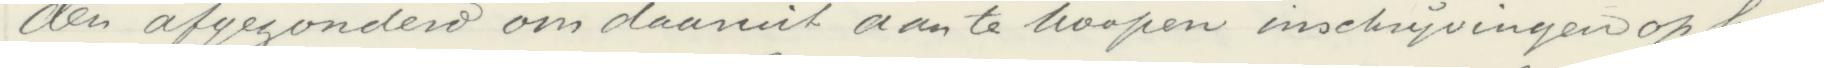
den afgezonderd om daaruit aan te koopen inschrijvingen op het
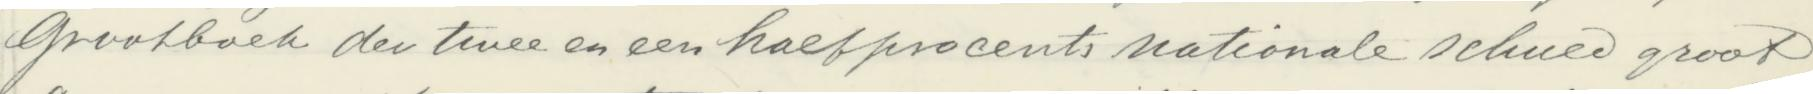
Grootboek der twee en een halfprocents nationale schuld groot
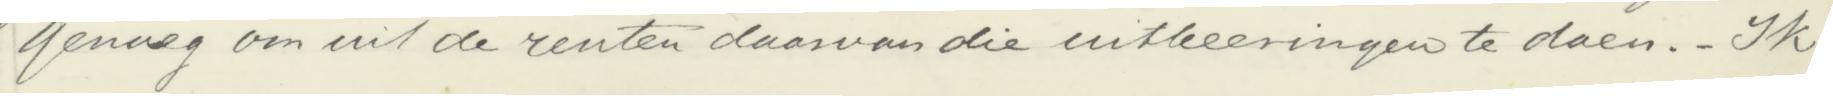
genoeg om uit de renten daarvan die uitkeeeringen te doen. - Ik
